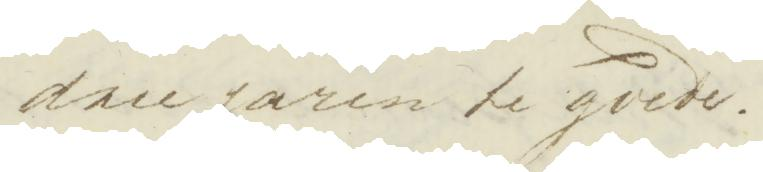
drie jaren te goede.
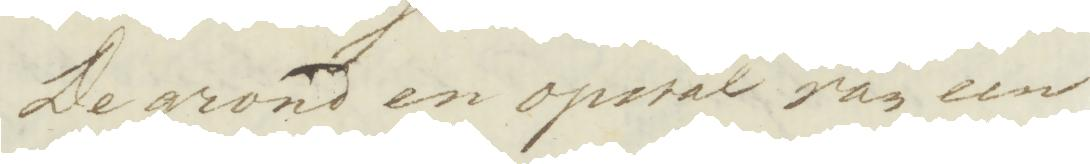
De grond en opstal van een
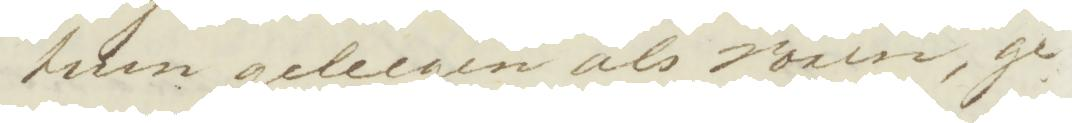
tuin geleegen als voren, ge„
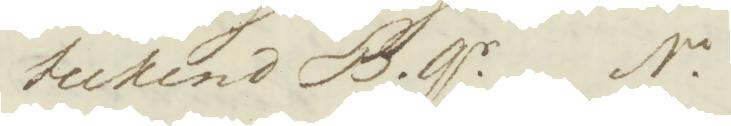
teekend B.G.r N.o
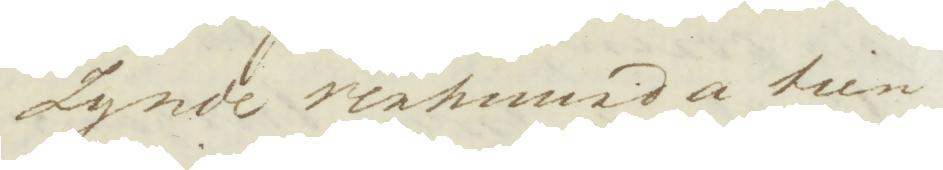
Zynde verhuurd a tien
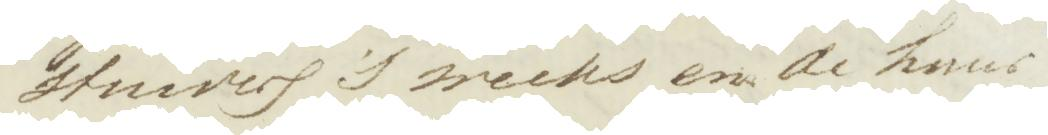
stuivers 's weeks en de huur
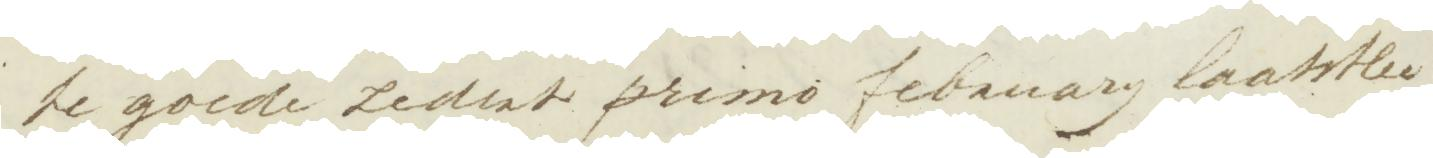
te goede zedert primo february laatstlee
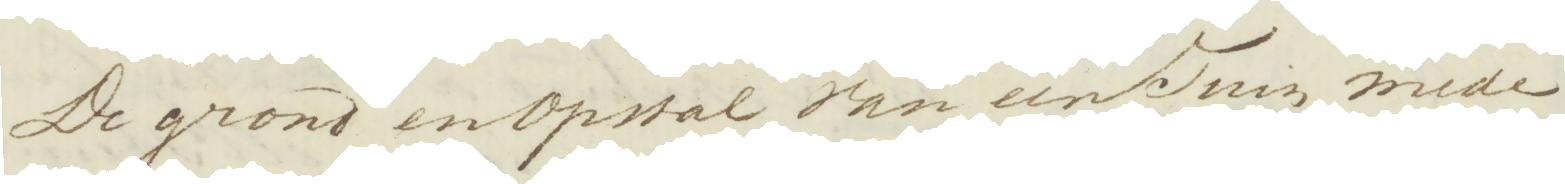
De grond en opstal van een Tuin mede
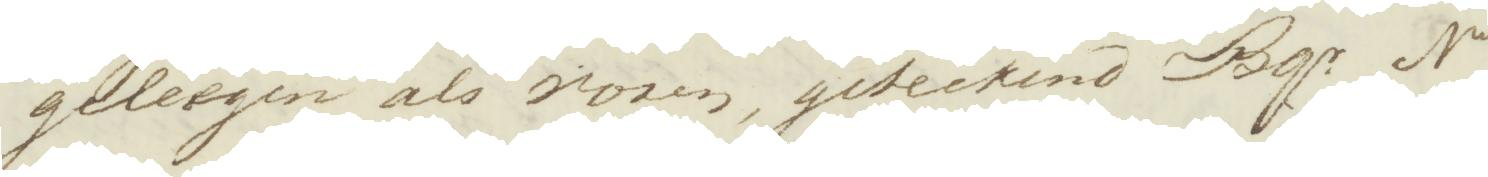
geleegen als voren, geteekend Bg.r No
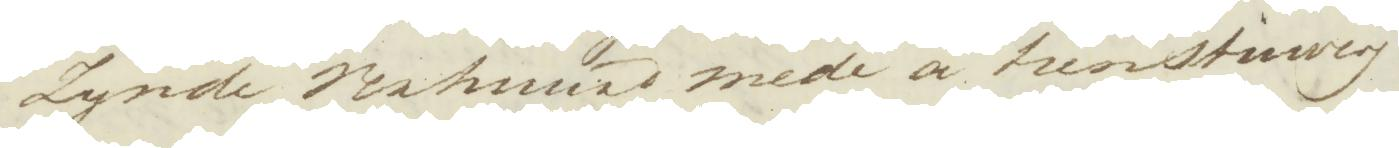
Zynde verhuurd mede a tien stuivers
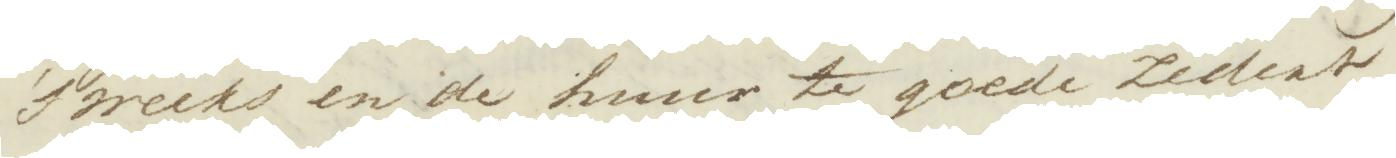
's weeks en de huur te goede zedert
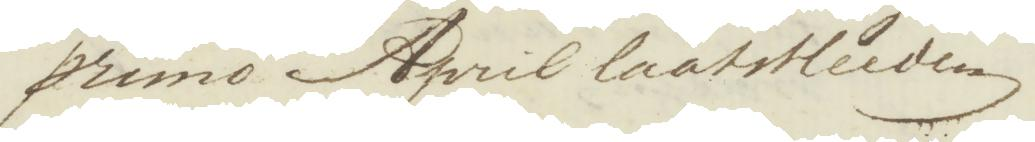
primo April laatstleeden
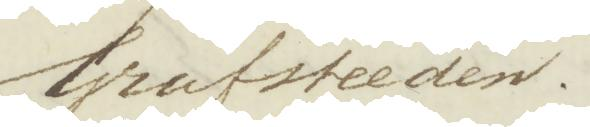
Grafsteeden.
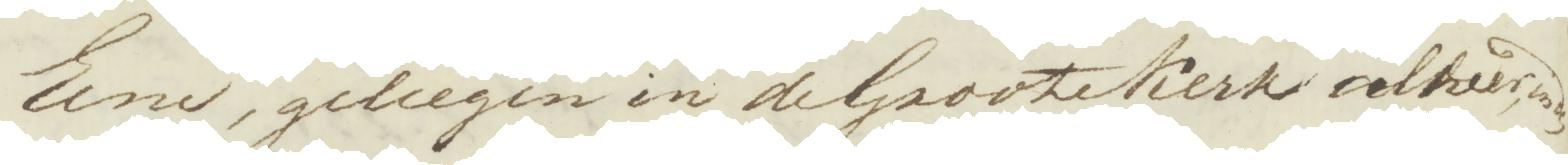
Eene, geleegen in de Groote Kerk alhier, in den
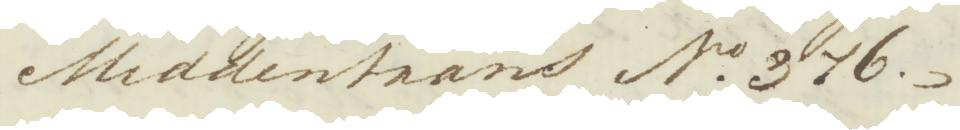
Middentrans N.o 376. —
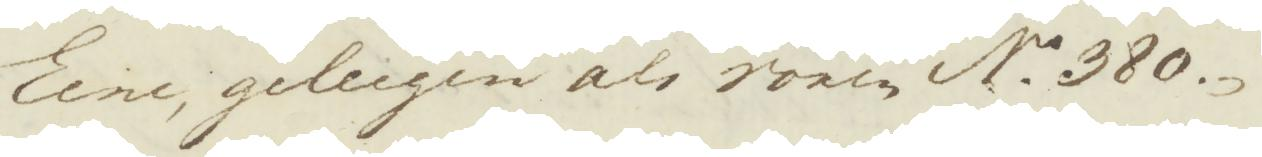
Eene, geleegen als voren N.o 380. —
